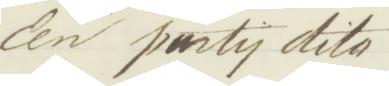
Een partij dito
